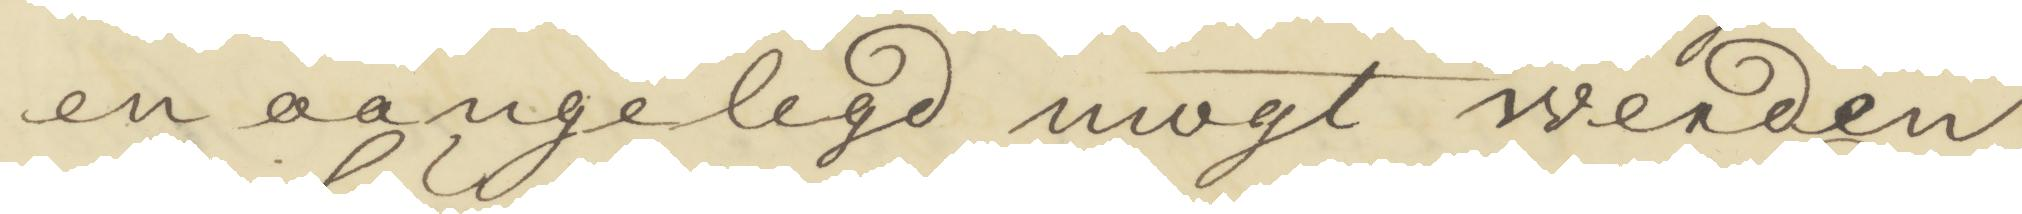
en aangelegd mogt werden
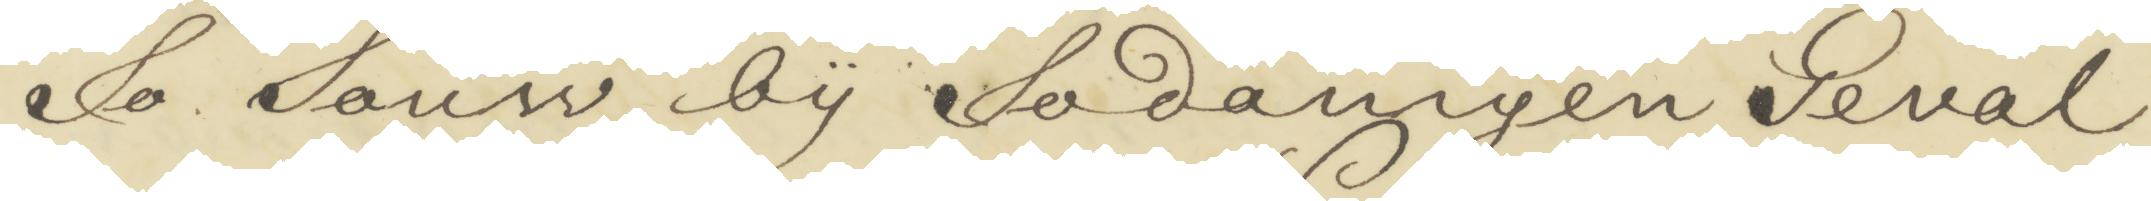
So Souw bij Sodanigen Geval
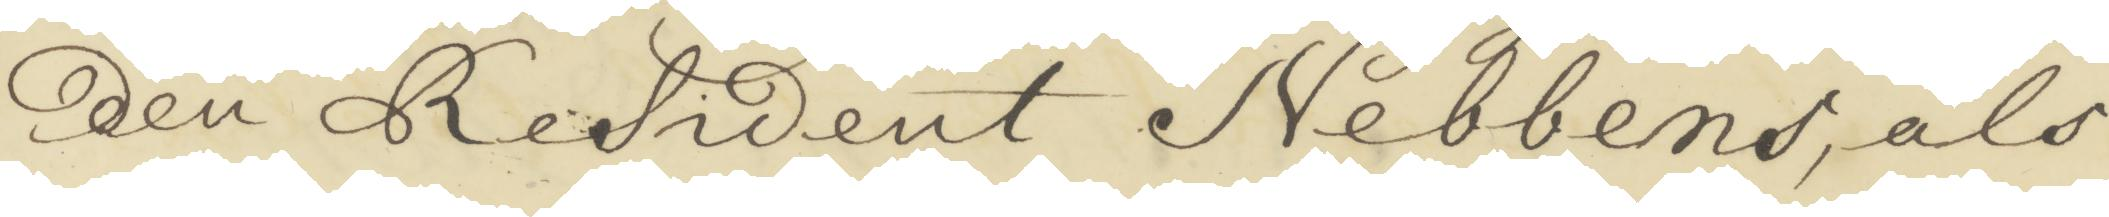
den Resident Nebbens, als
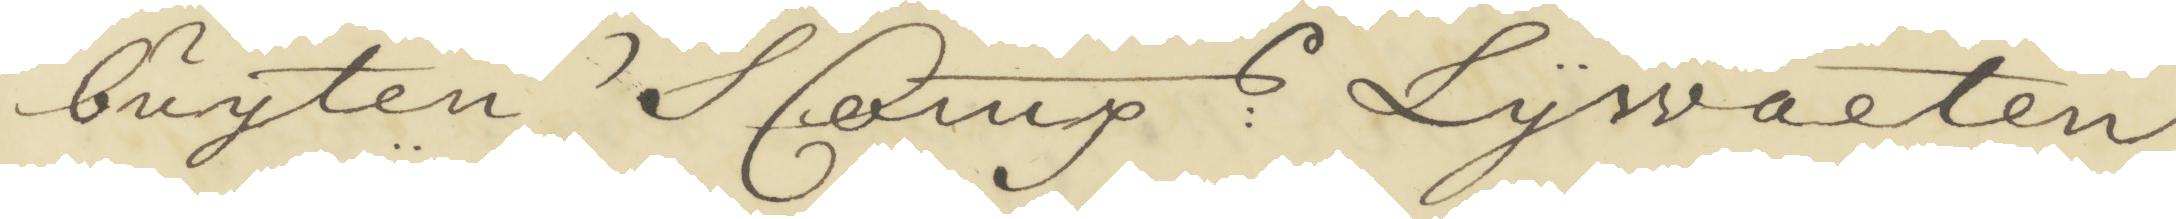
buijten ’S Comp:s Lijwaeten,
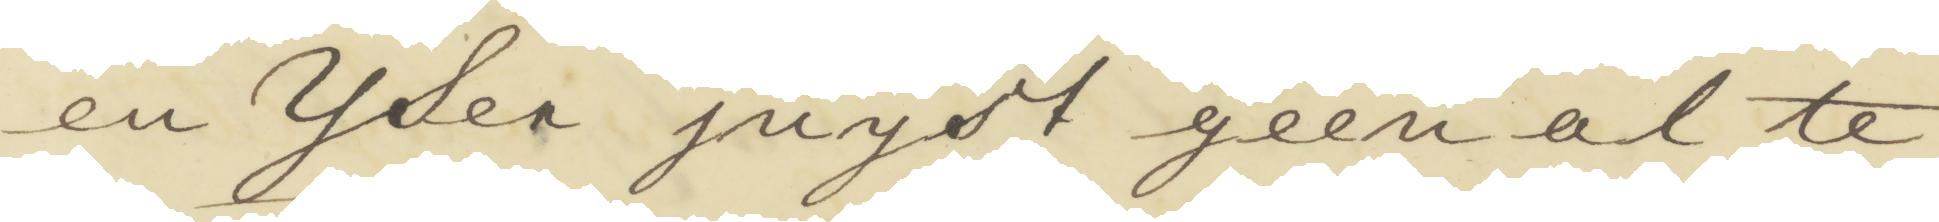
en IJser juijst geen al te
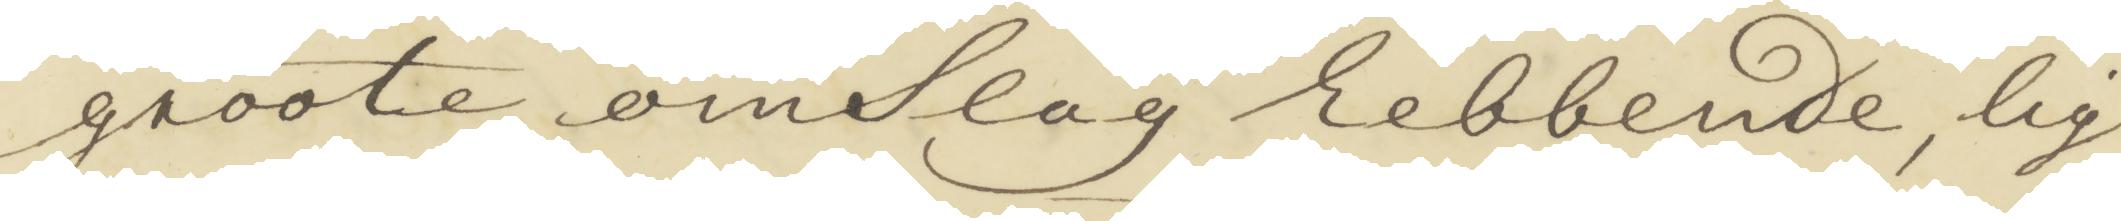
groote omslag hebbende, lig
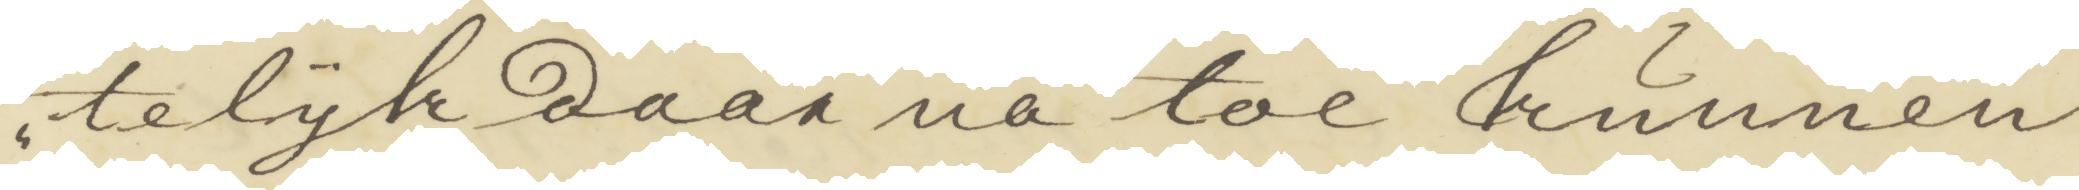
„telijk daar na toe kunnen
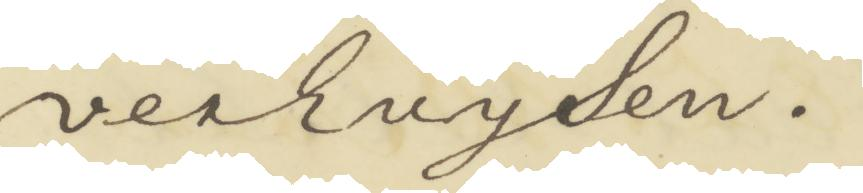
verhuijsen.
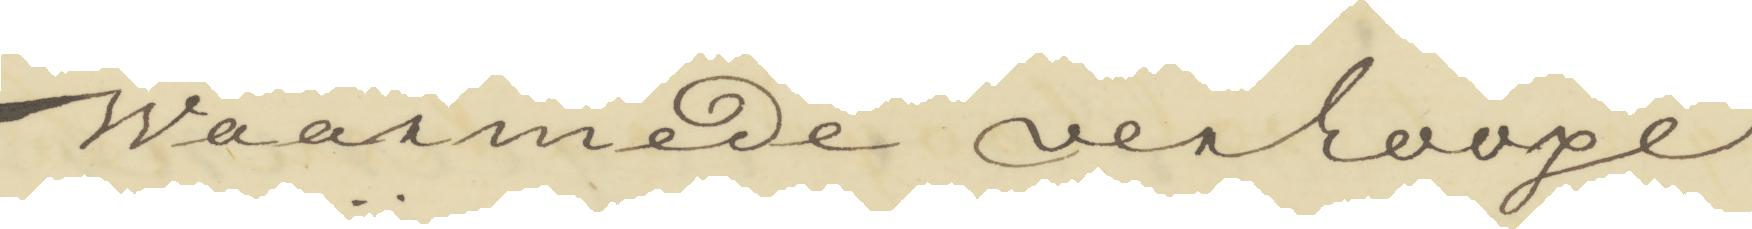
Waar mede verhoope
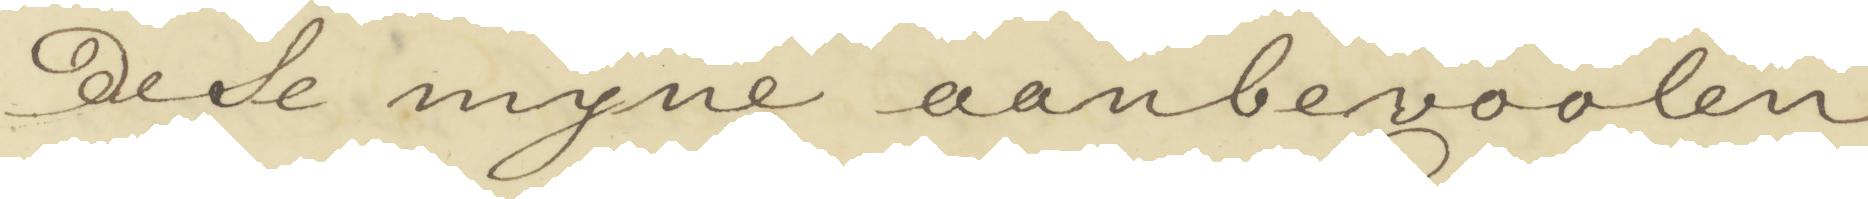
dese mijne aanbevoolen
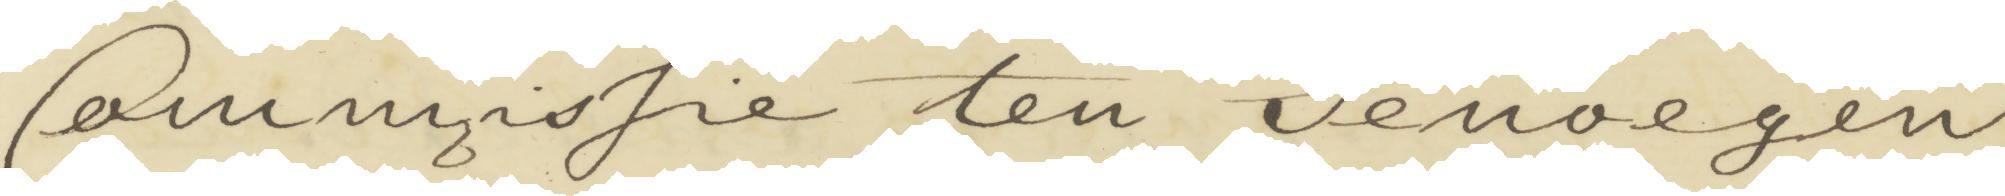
Commissie ten Genoegen
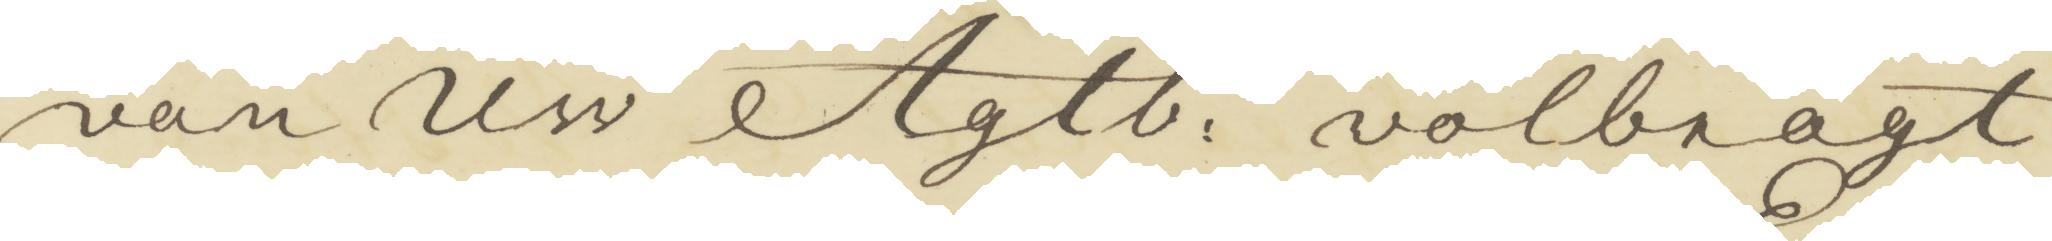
van uw Agtb:ns volbragt
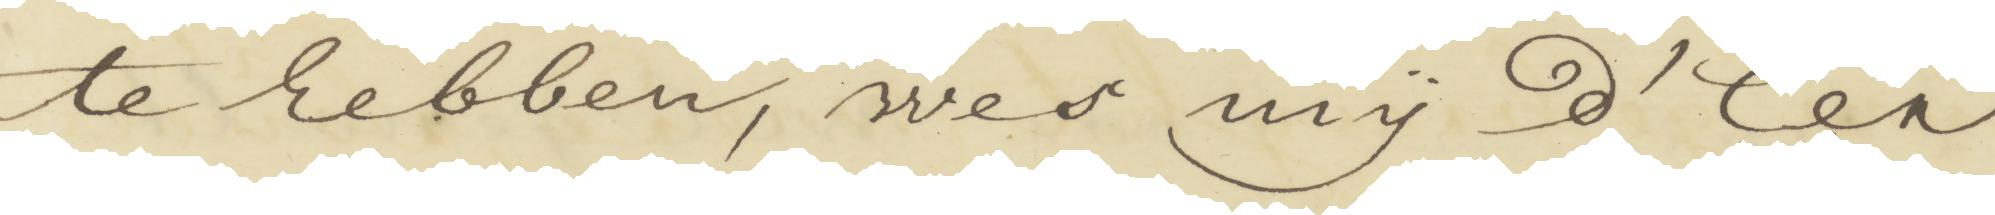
te hebben, wes mij d' Eer
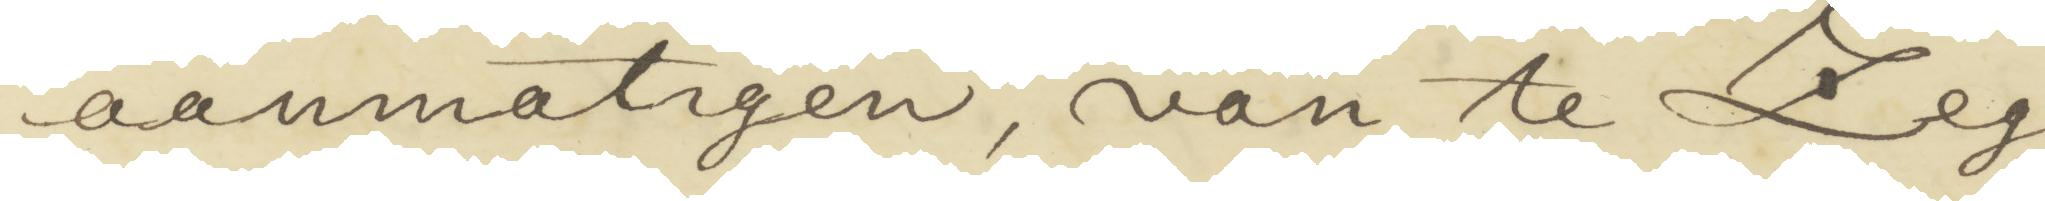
aanmatigen, van te Zeg
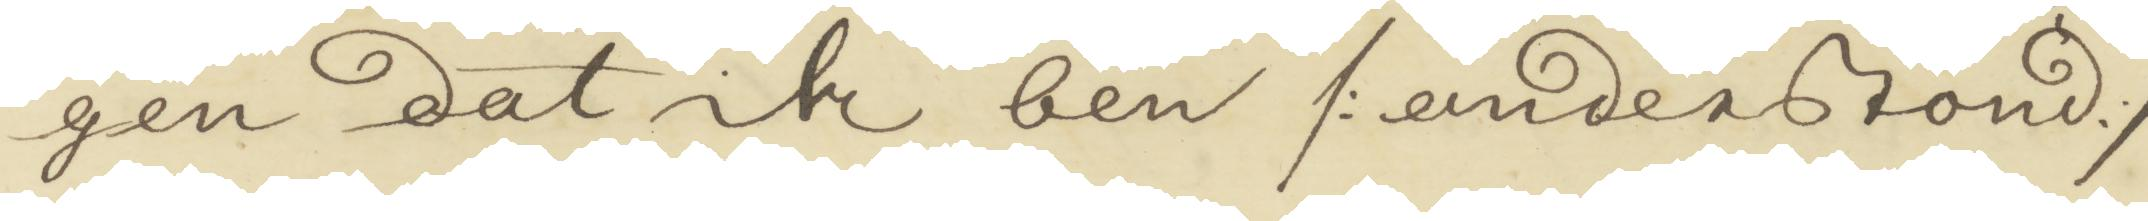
gen dat ik ben /:onder stond:/
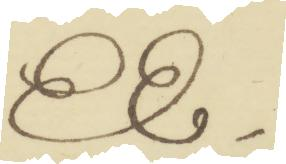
EE:
